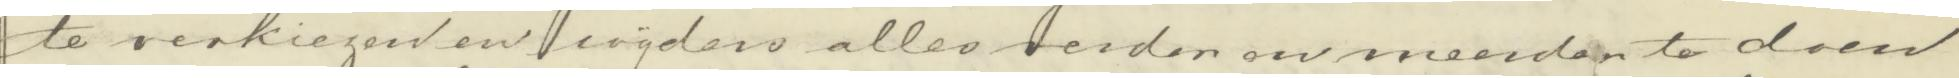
te verkiezen en wijders alles verder en meerder te doen
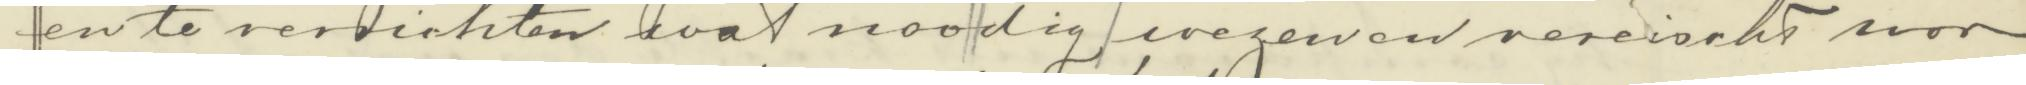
en te verrichten wat noo||dig|wesen en vereischt wor
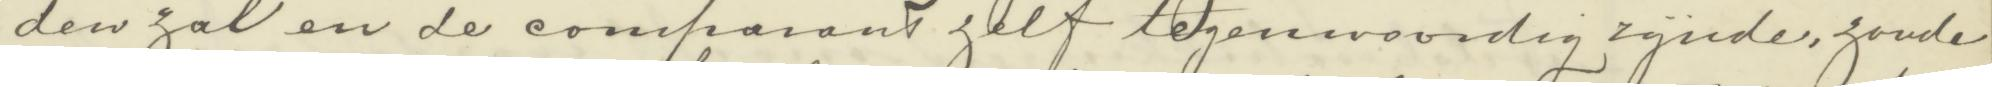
den zal en de comparant zelf tegenwoordig zijnde, zoude
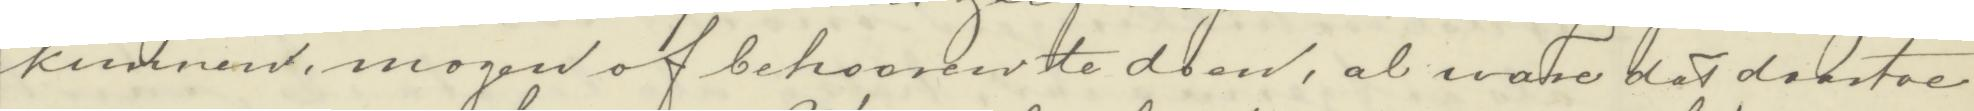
kunnen, mogen of behooren te doen, al ware dat daartoe
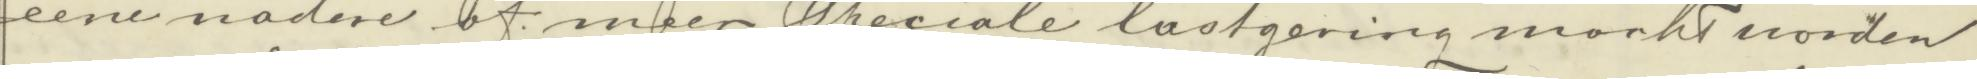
eene nadere of meer speciale lastgeving mocht worden
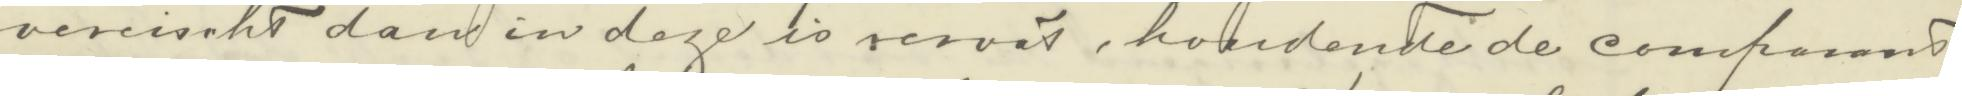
vereischt dan in deze is vervat, houdende de comparant
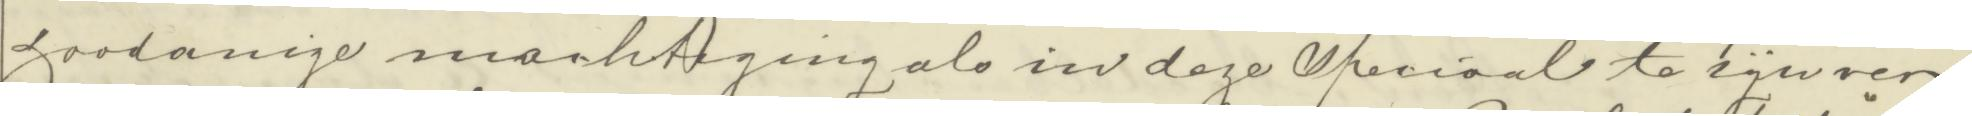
zoodanige machtiging als in deze speciaal te zijn ver
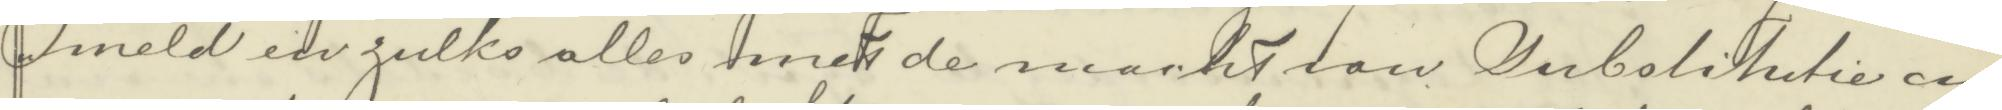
meld en zulks alles met de macht van substitutie en
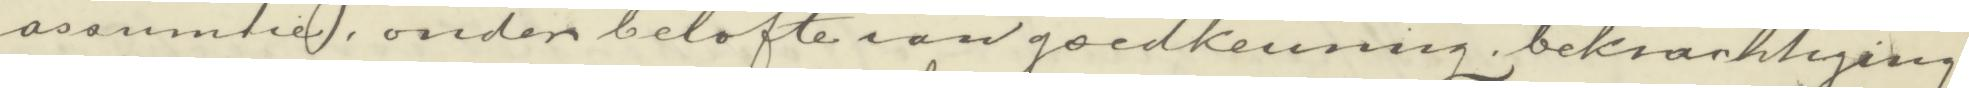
assumtie, onder belofte van goedkeuring, bekrachtiging
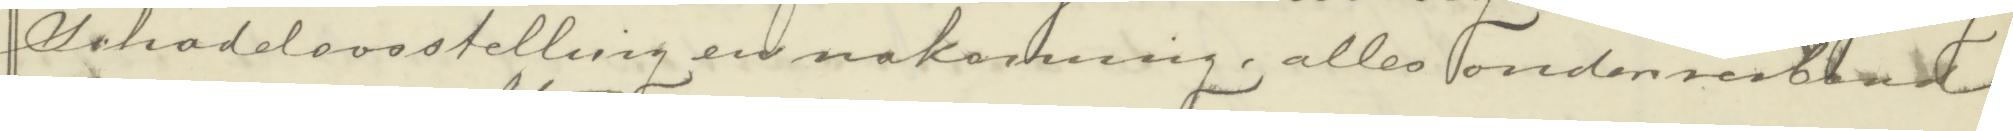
schadeloosstelling en nakoming, alles onder verband
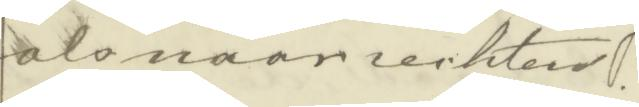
als naar rechten.
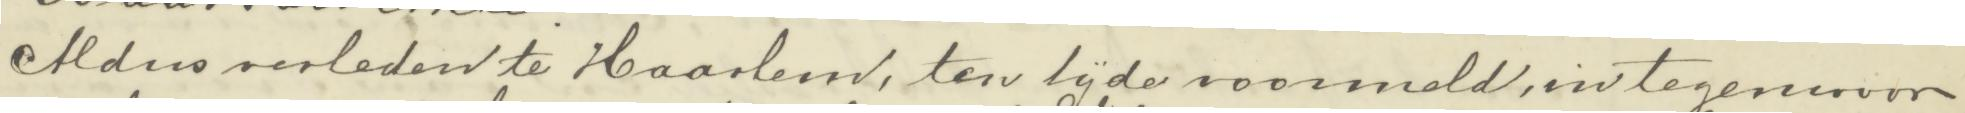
Aldus verleden te Haarlem, ten tijde voormeld, in tegenwoor
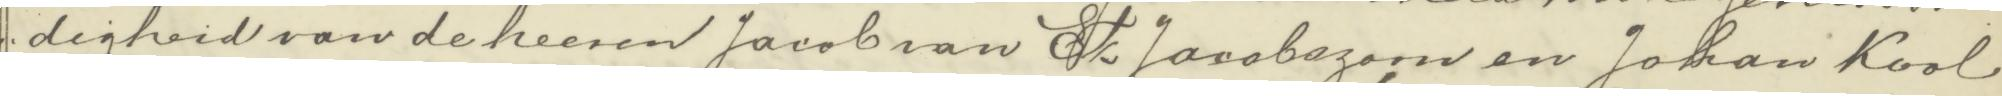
„digheid van de heeren Jacob van Ek Jacobszoon en Johan Kool
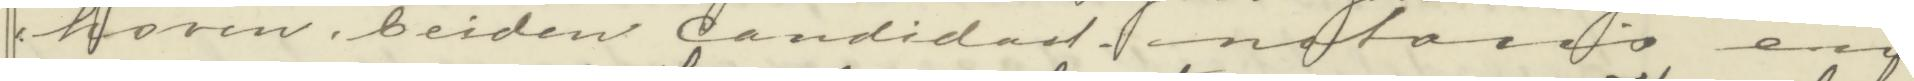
„hoven, beiden Candidaat- notaris en
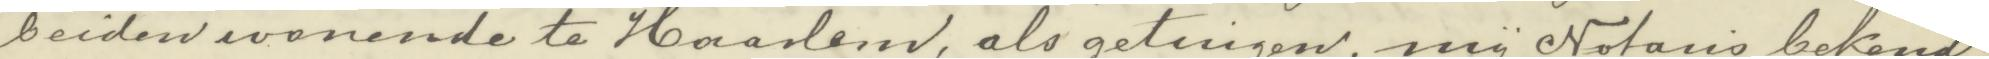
beiden wonende te Haarlem, als getuigen, mij Notaris bekend
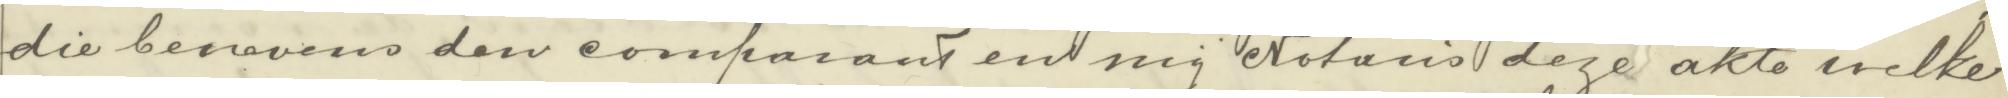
die benevens den comparant en mij Notaris deze akte welke
